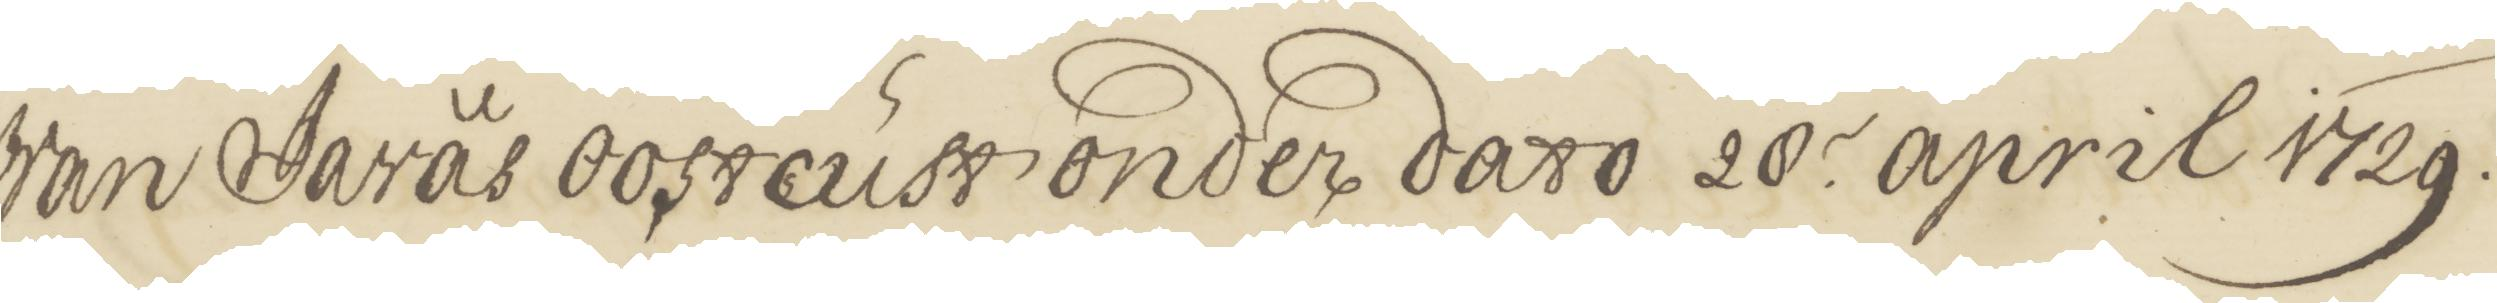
Van Javâs oost cust onder dato 28.' april 1729
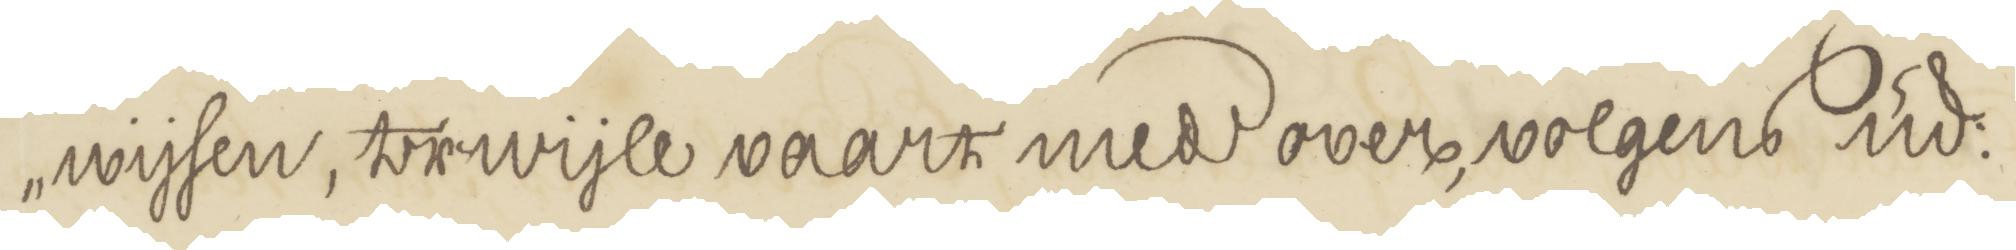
„wijsen, terwijle vaart mede over, volgens uE:
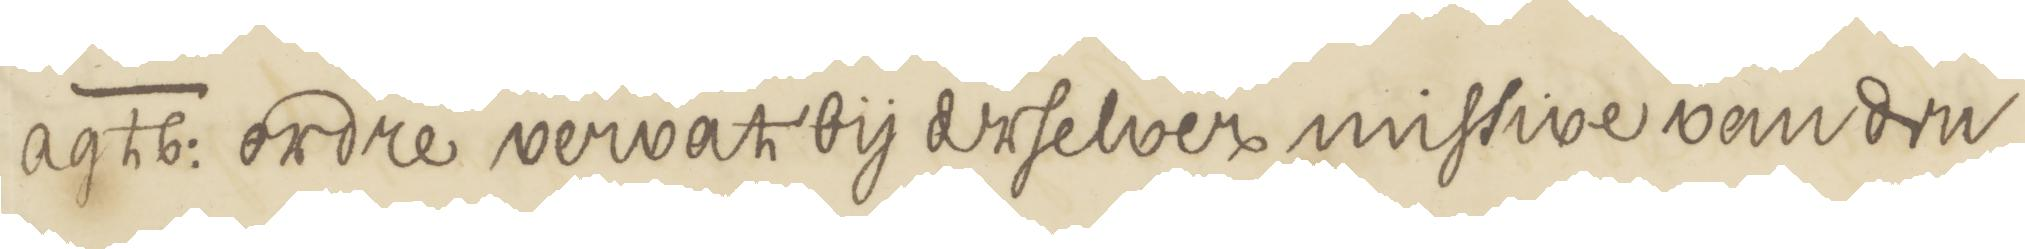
agtb: ordre vervat bij derselver missive van den
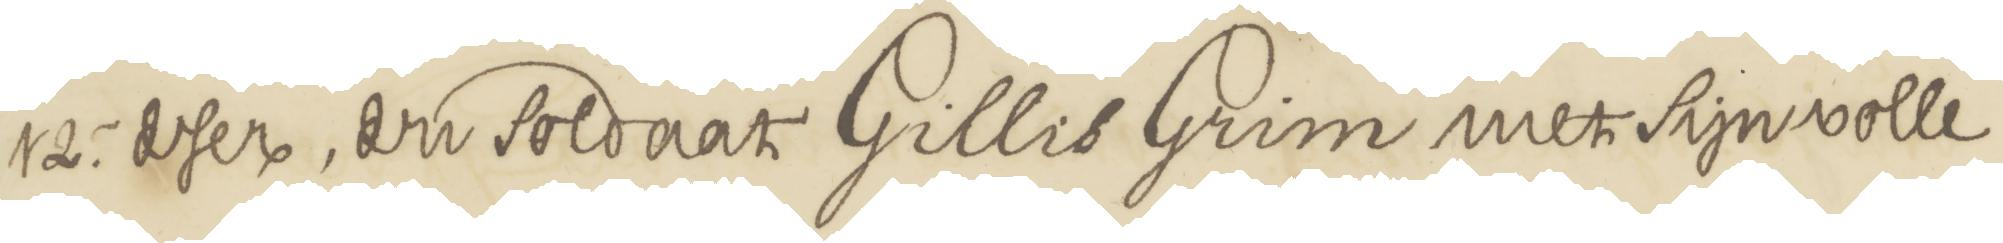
12.' deser, den soldaat Gillis Grim met sijn volle
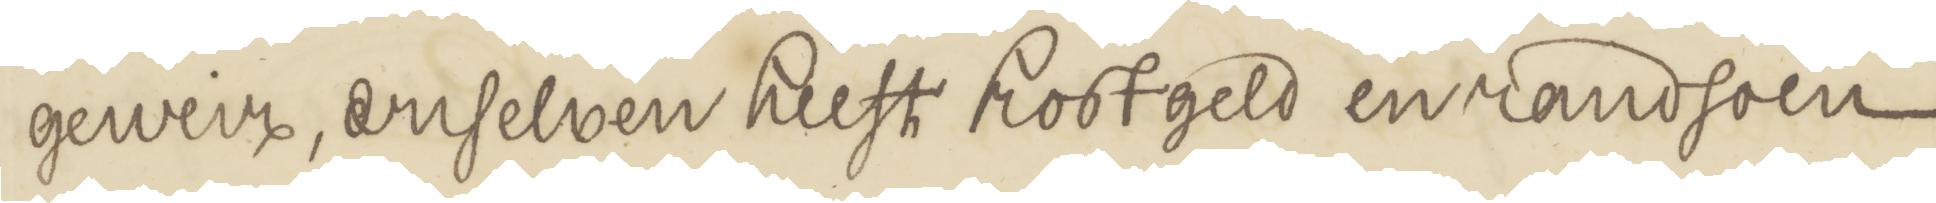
geweir, denselven heeft kostgeld en randsoen
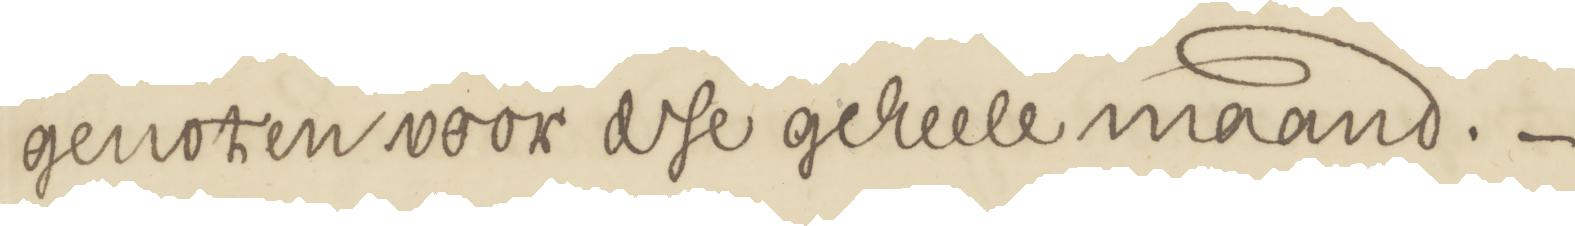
genoten voor dese geheele maand. —
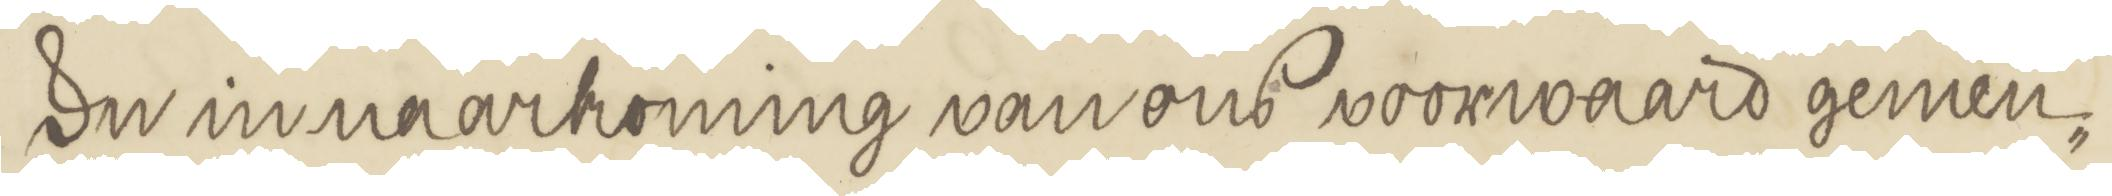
En in naarkoming van ons voorwaard gemen„
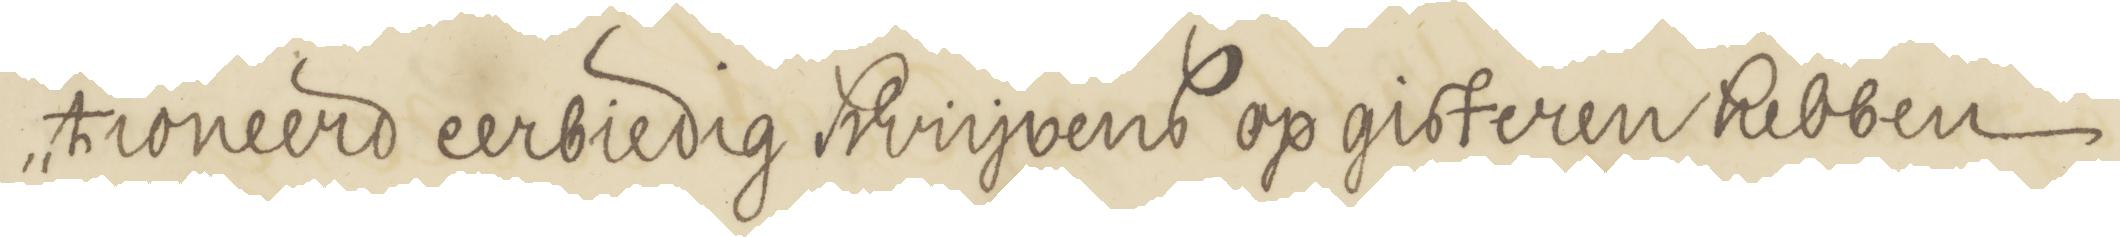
„tioneerd eerbiedig schrijvens op gisteren hebben
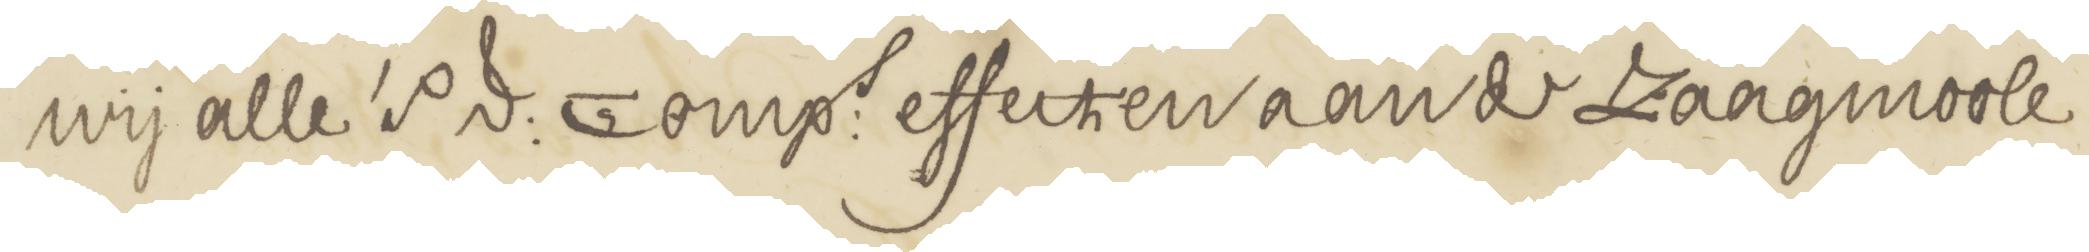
wij alle ’s E: comp:s effecten aan de zaagmoole
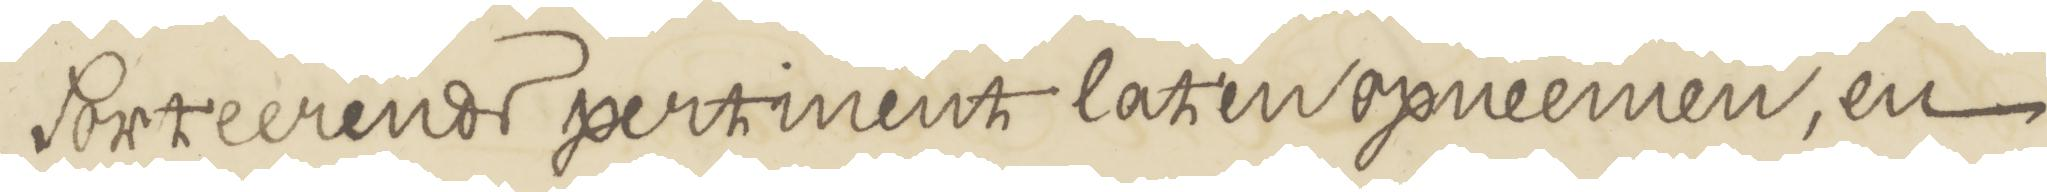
sorteerende pertinent laten opneemen, en
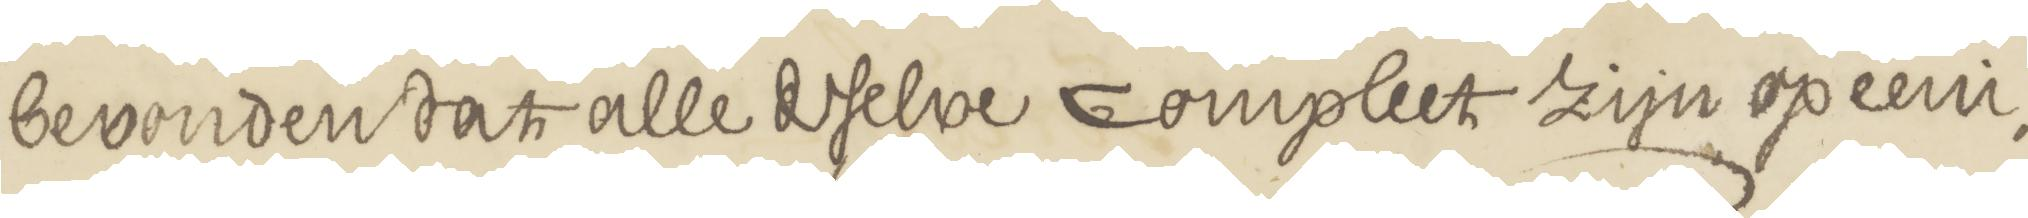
bevonden dat alle deselve compleet zijn op eeni
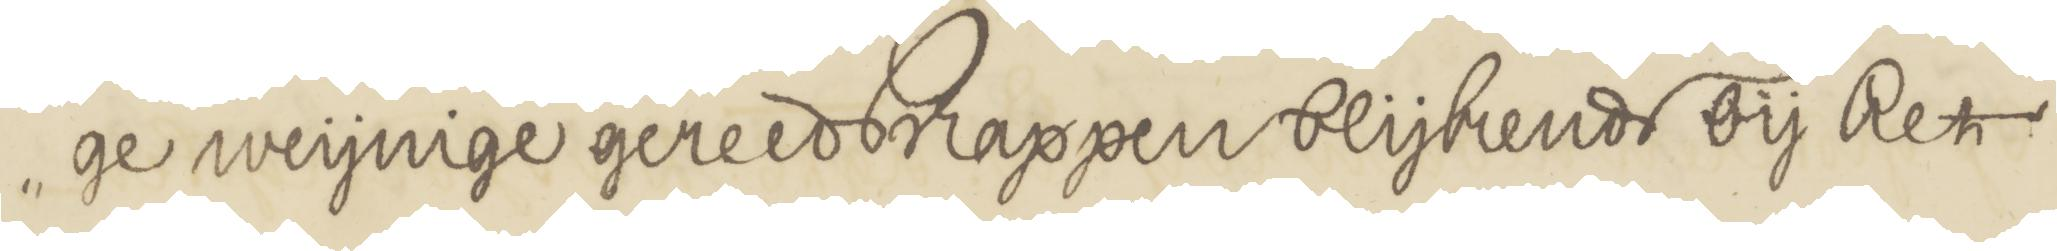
„ge weijnige gereedschappen blijkende bij het
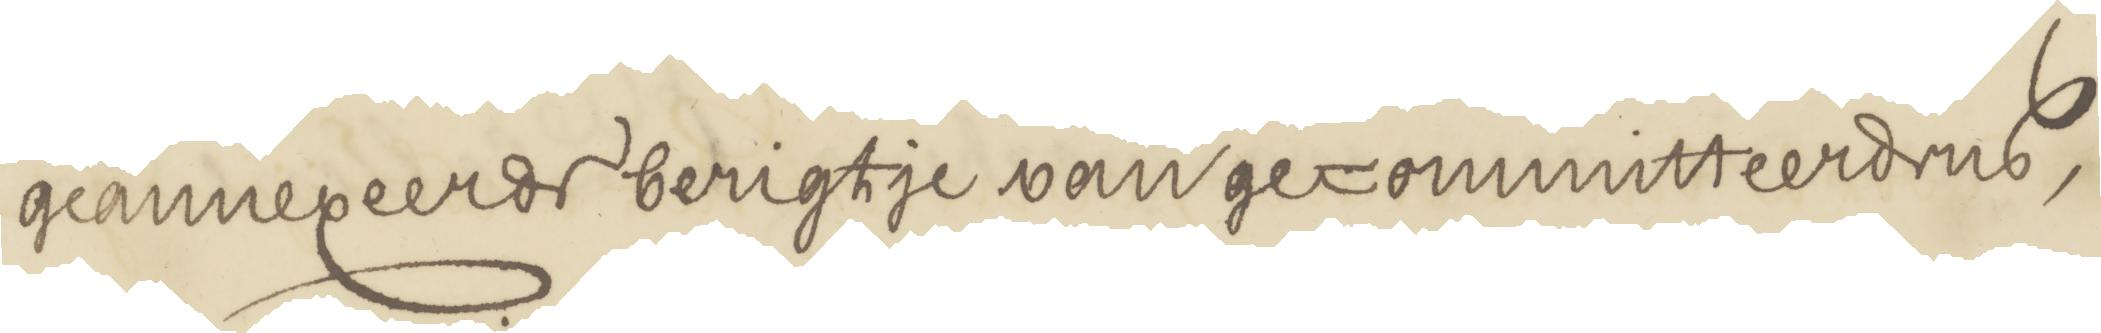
geannexeerde berigtje van gecommitteerdens,
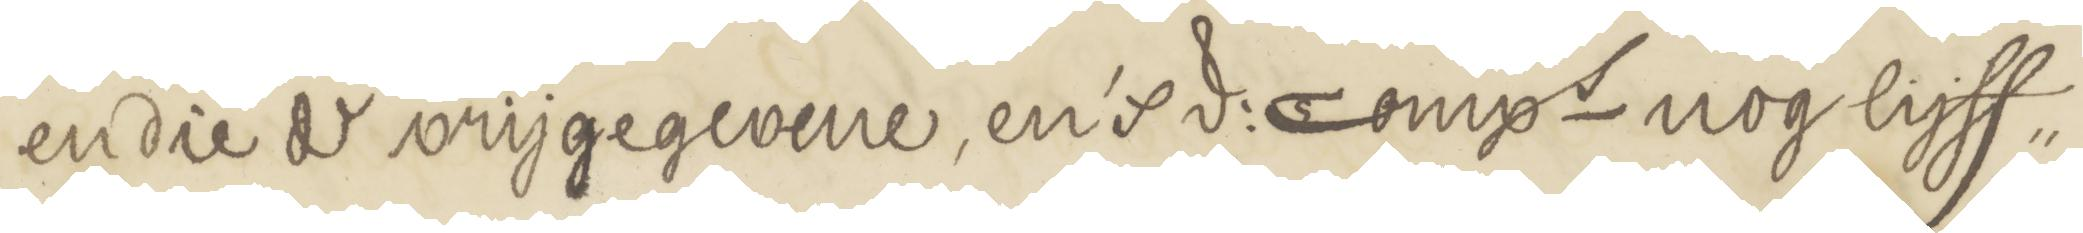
en die de vrijgegevene, en ’s E: comp-s nog lijff„
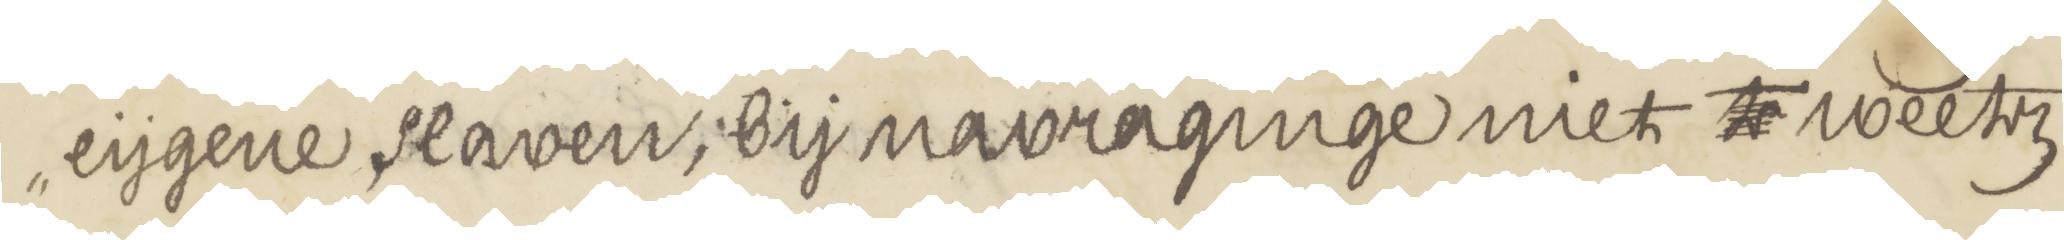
„eijgene slaven, bij navraginge niet te weeten
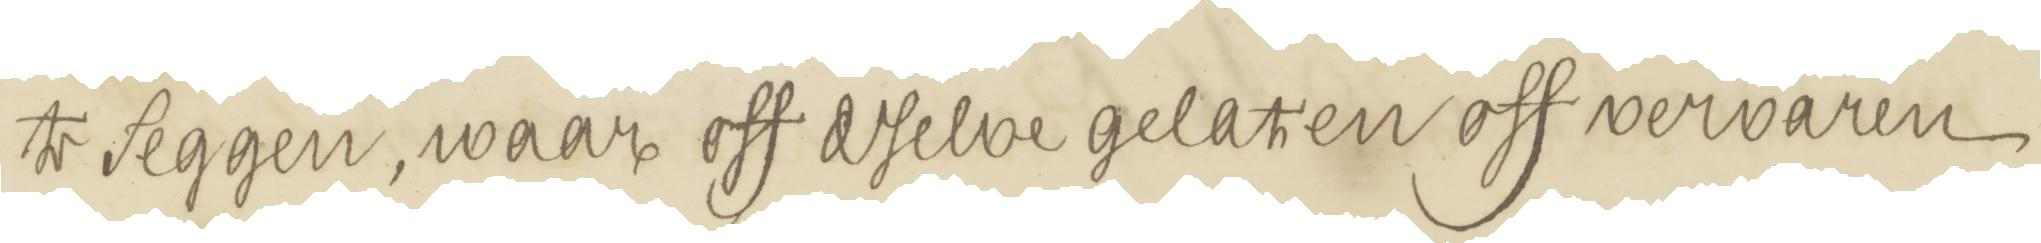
te seggen, waar off deselve gelaten off vervaren
